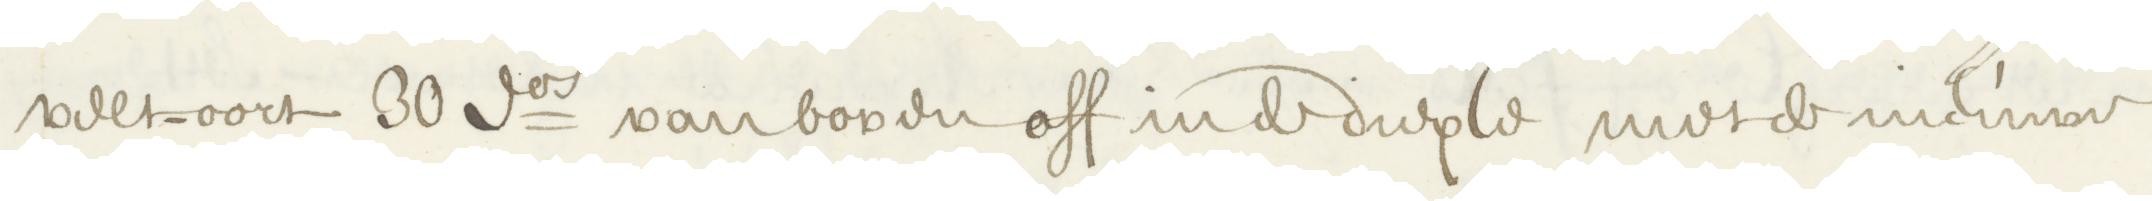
velt-oort 30 d=os van boven aff in de diepte met de nieuwe
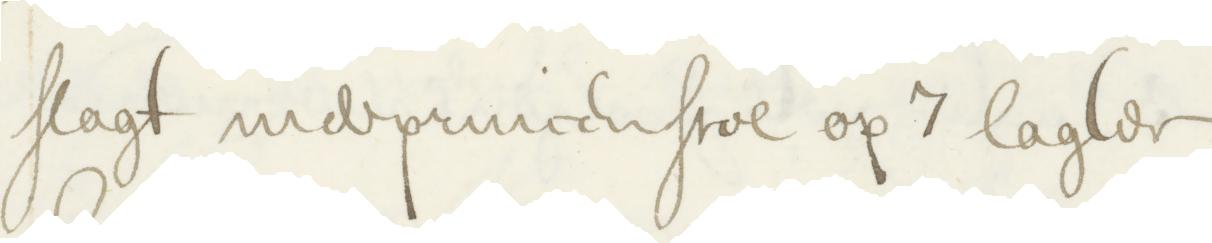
slagt indeprincenstol op 7 lagter
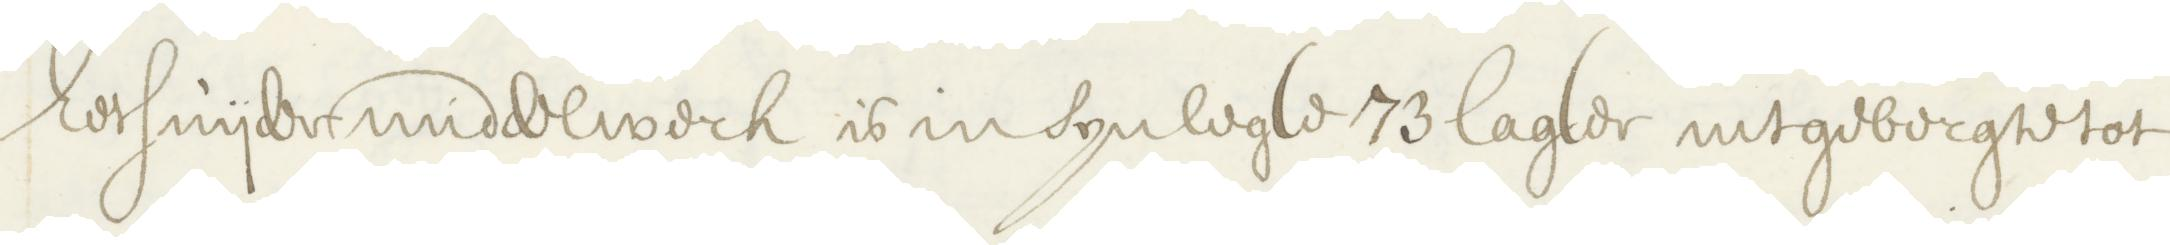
het Suijder middelwerk is in syn legte 73 lagter int gebergte tot
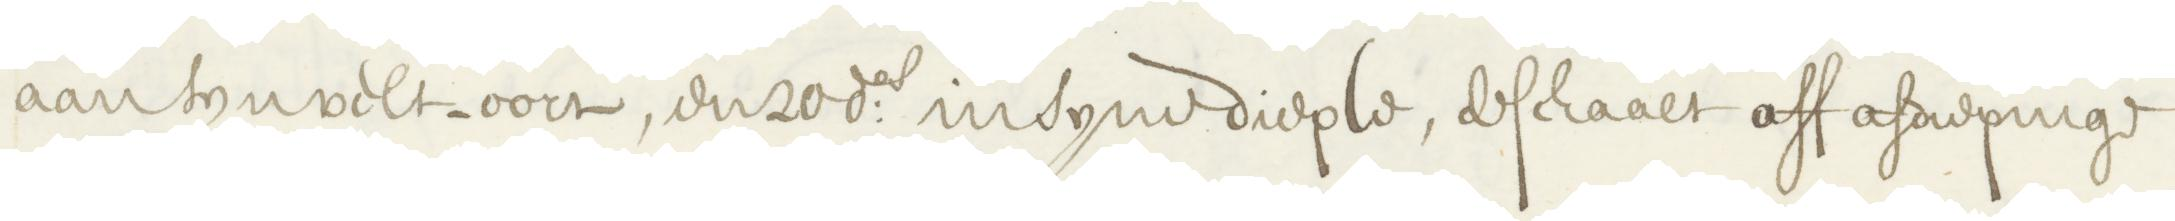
aan syn velt-oort, en 20 d:os in syne diepte, deschaalt aff afdiepinge
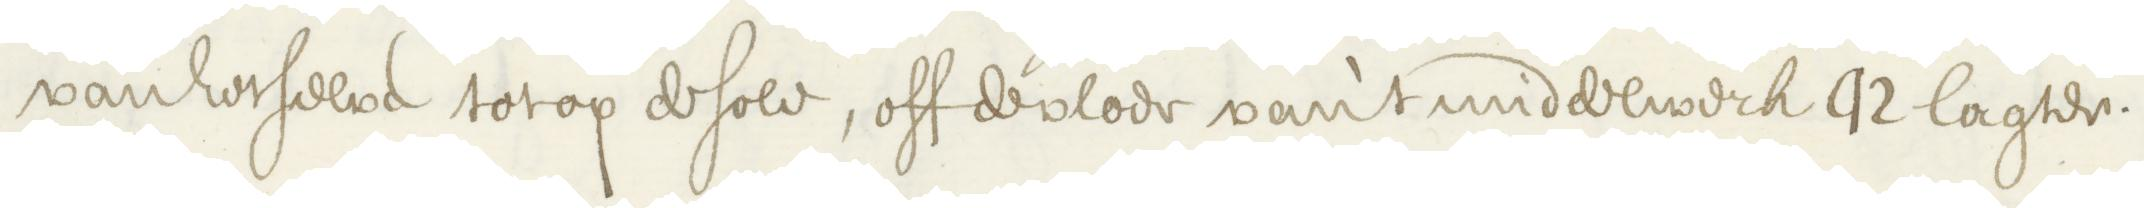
van hetselve tot op de sole, off de vloer van't middelwerk 42 lagter.
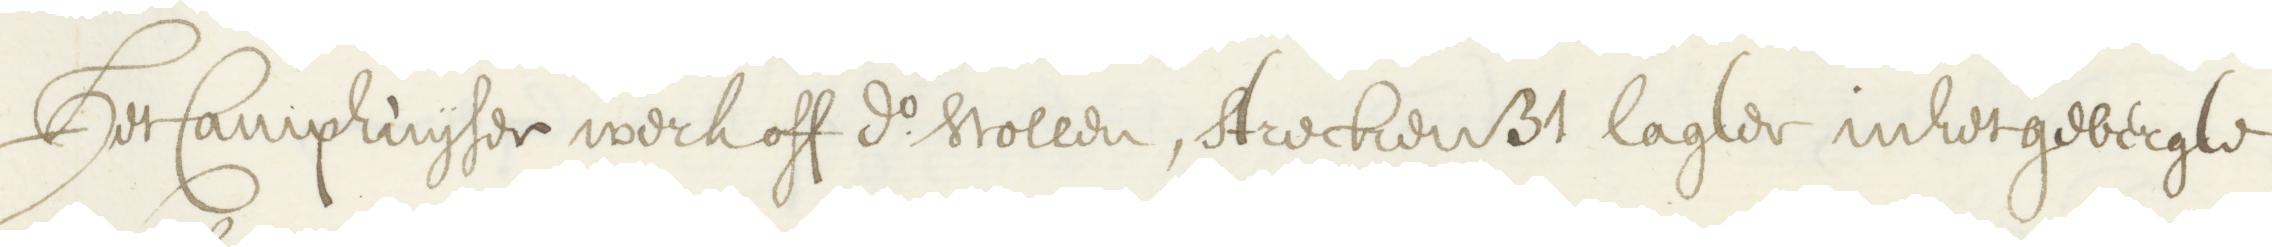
Het Camphuijser werk off d:o stollen, strecken 31 lagter in het gebergte
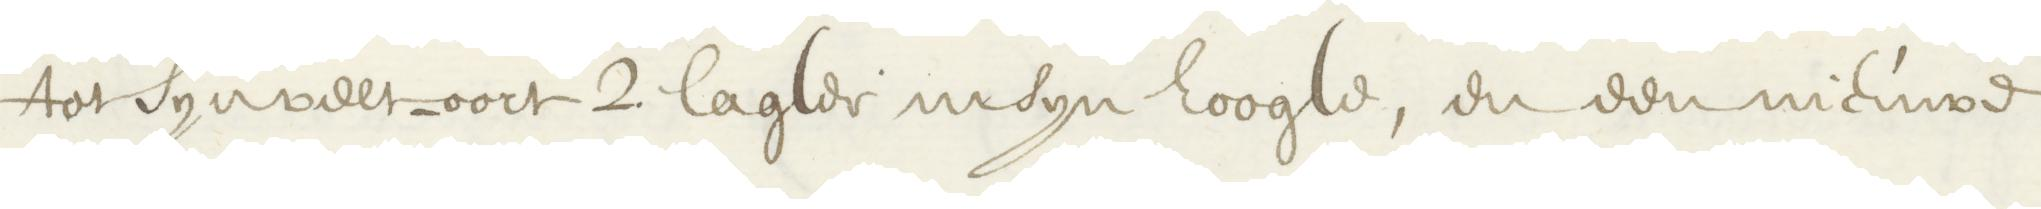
tot syn velt-oort 2. lagter in syn hoogte, en een nieuwe
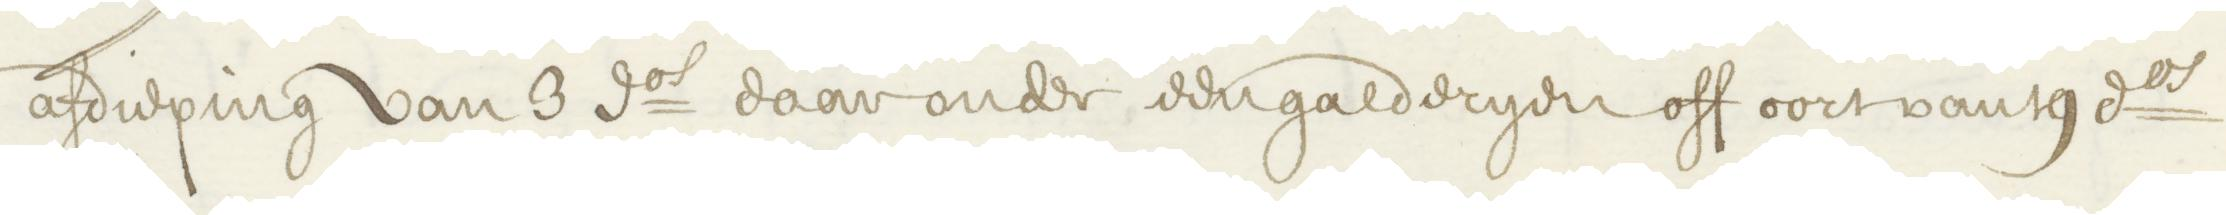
afdieping van 3 d=os daar onder een galderyen off oort van 19 d=os
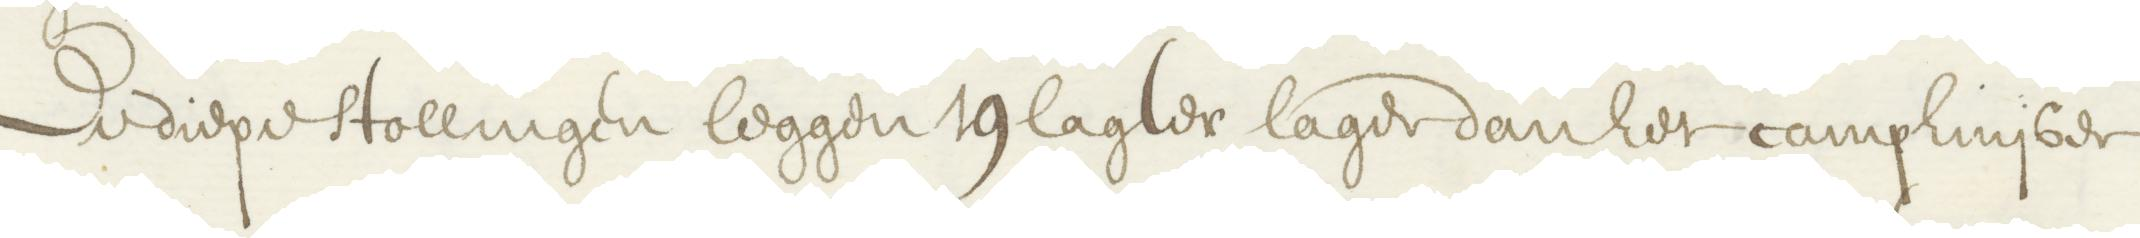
De diepe stollingen leggen 19 lagter lager dan het camphuijser
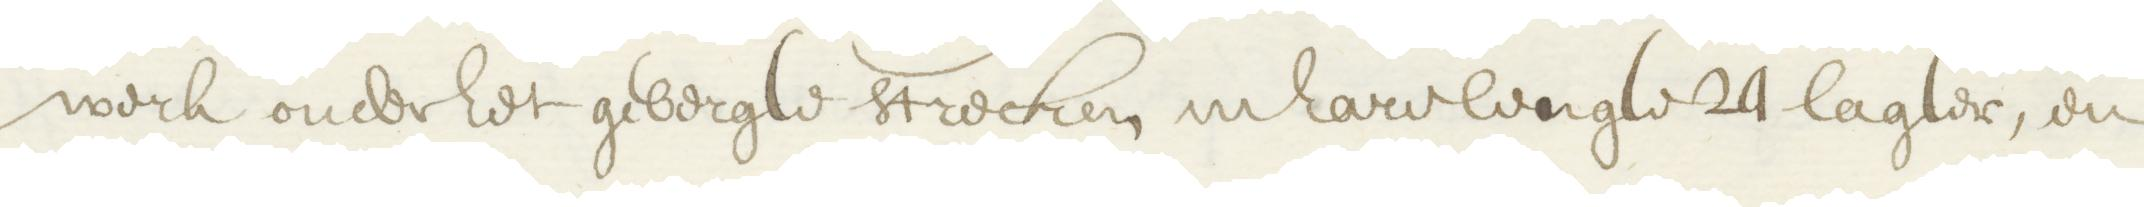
werk onder het gebergte strecken in hare lengte 24 lagter, en
